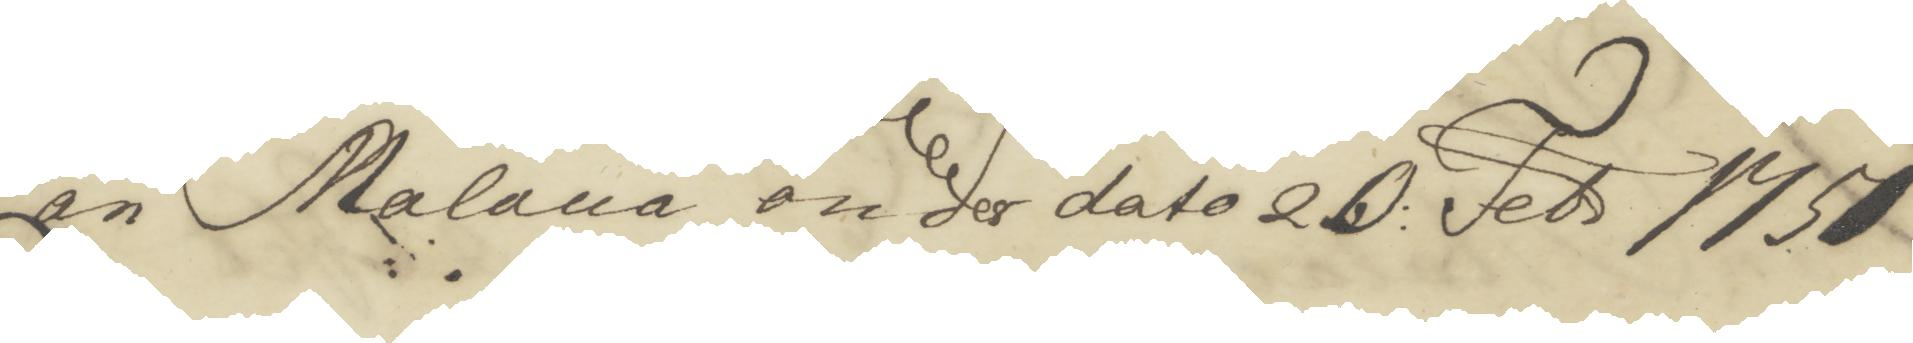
an Malacca onder dato 20: Feb: 1751
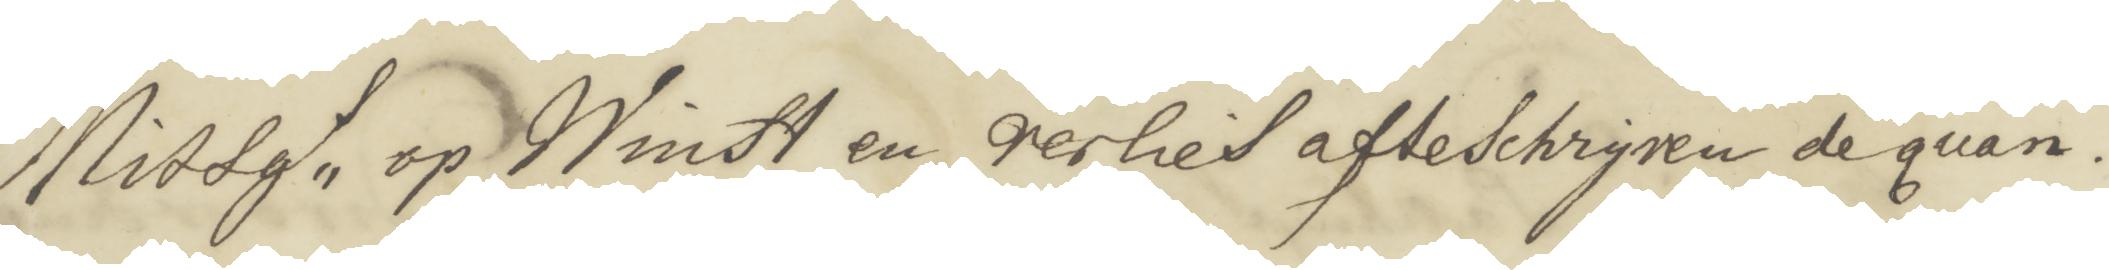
Mitsg„s op Winst en verlies afteschrijven de quan.
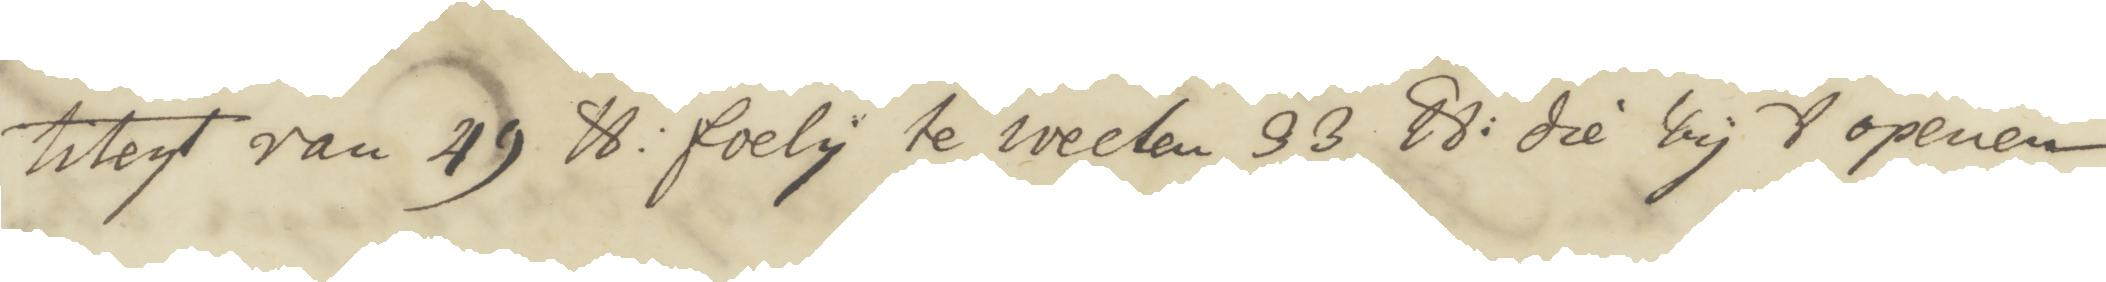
titeyt van 49 lb: foelij te weeten 33 lb: die bij ’t openen
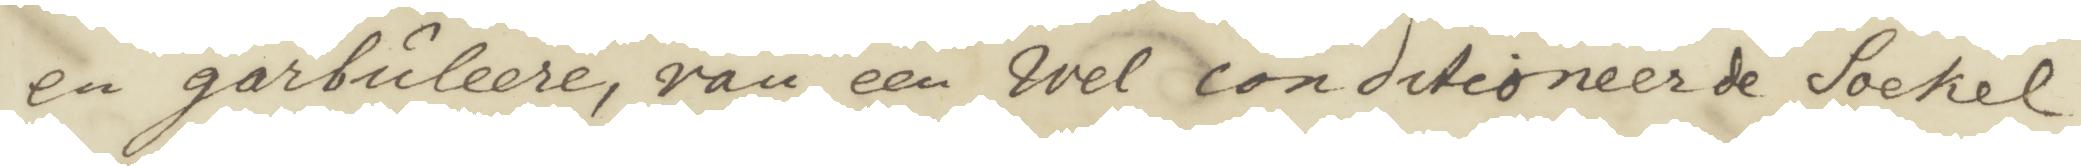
en garbuleere, van een wel conditioneerde soekel
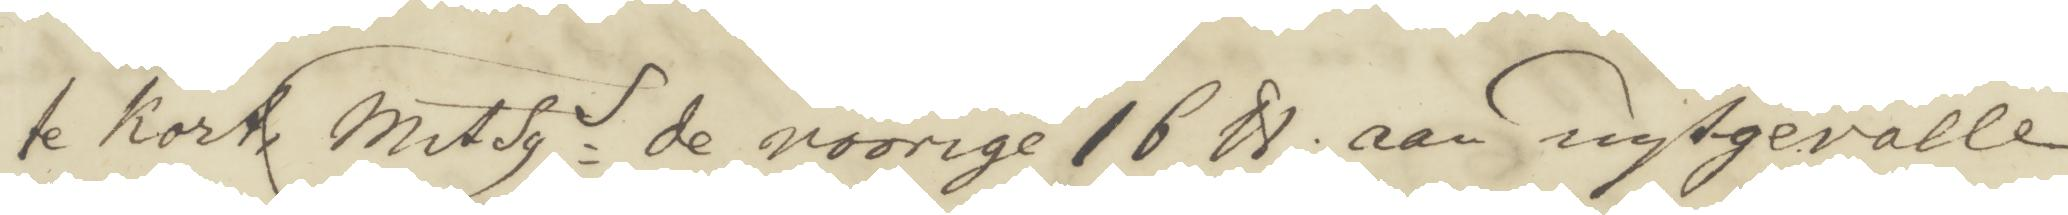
de kort mitsg=s de voorige 16 lb: aan uytgevalle
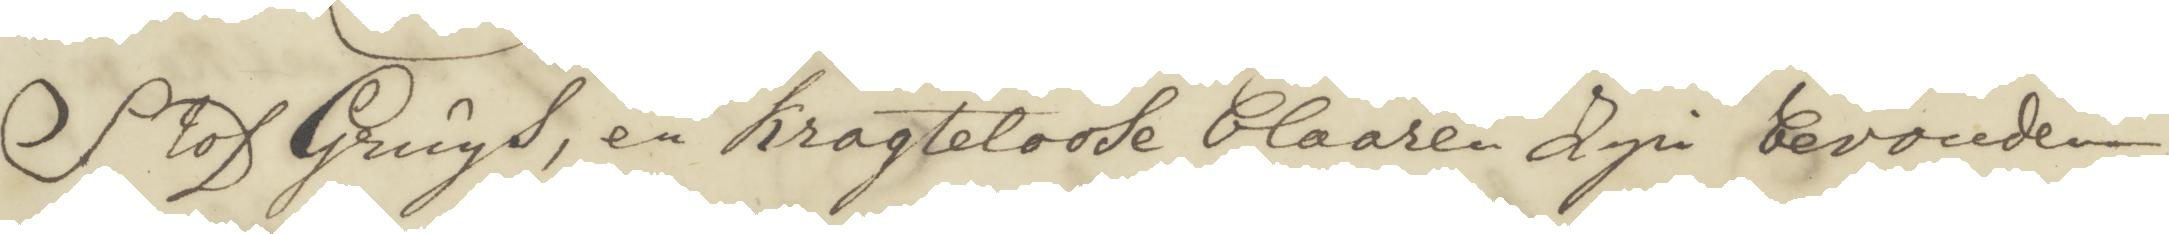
Stof Gruys, en kragteloose blaaren zijn bevonden
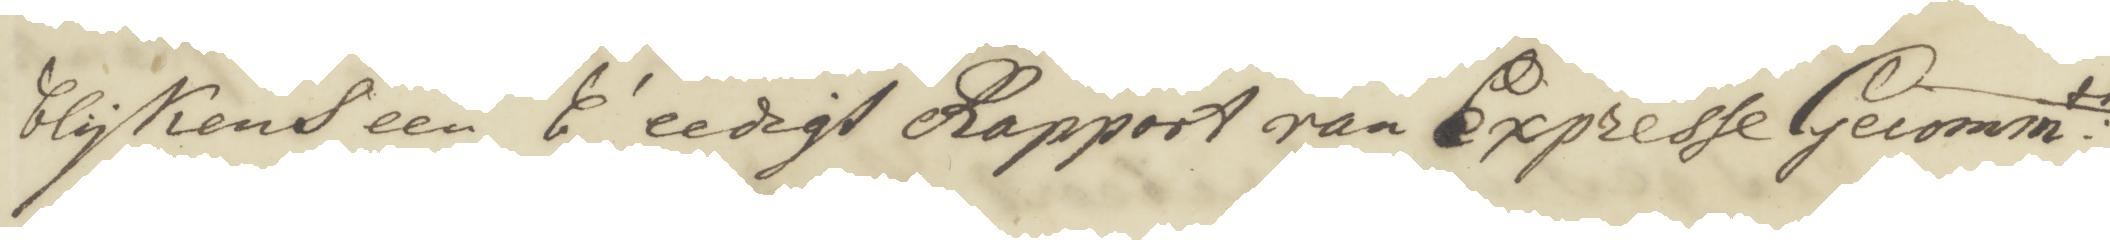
blijkens een b'eedigt Rapport van Expresse Gecomm:t
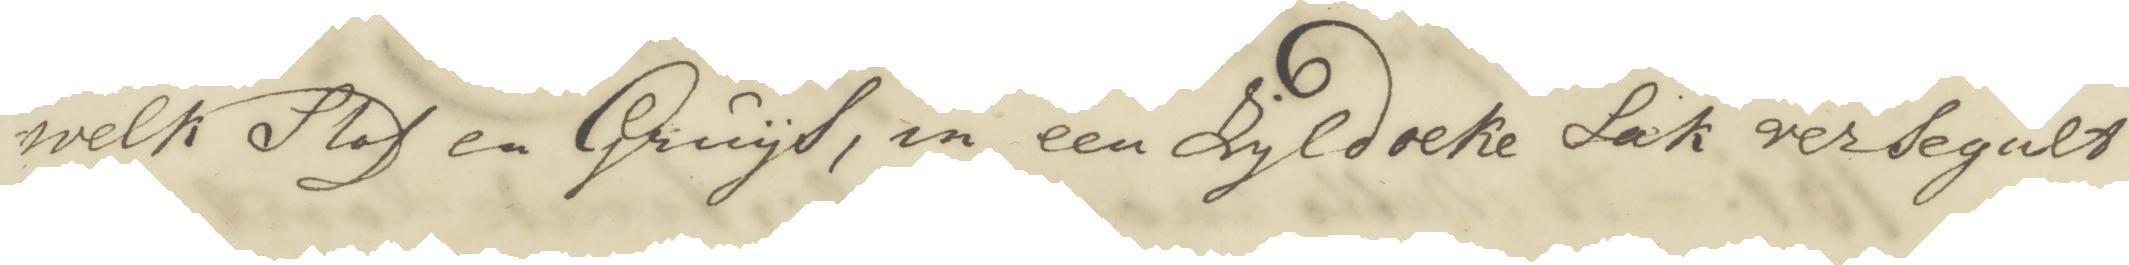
welk Stof en Gruijs, in een zijldoeke sak versegult
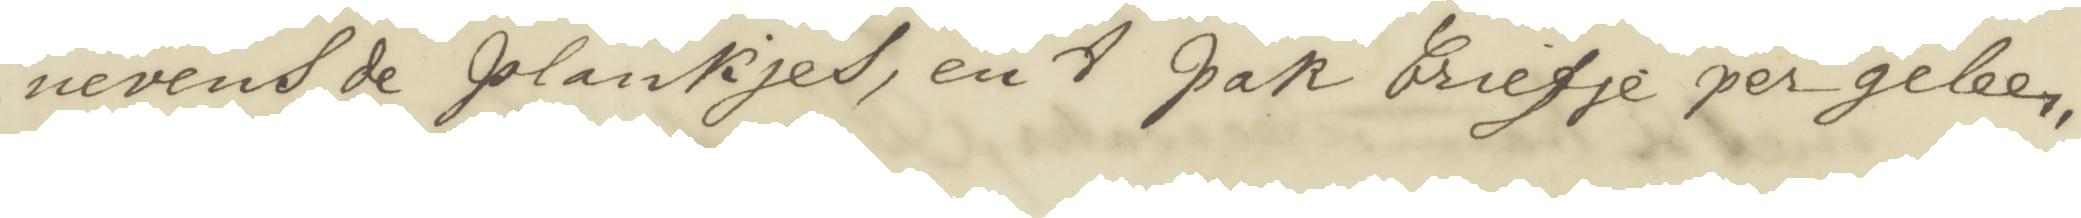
nevens de plankjes, en 't pak briefje per gelee„
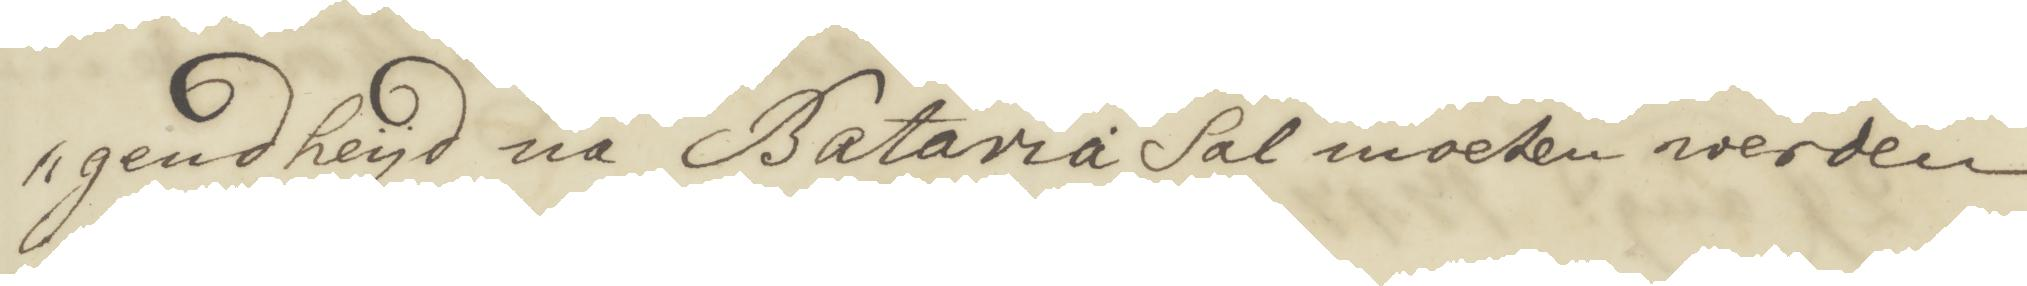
„gendheijd na Batavia sal moeten werden
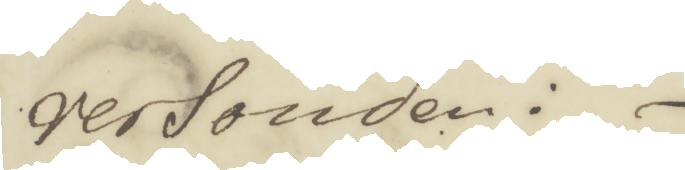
versonden: —
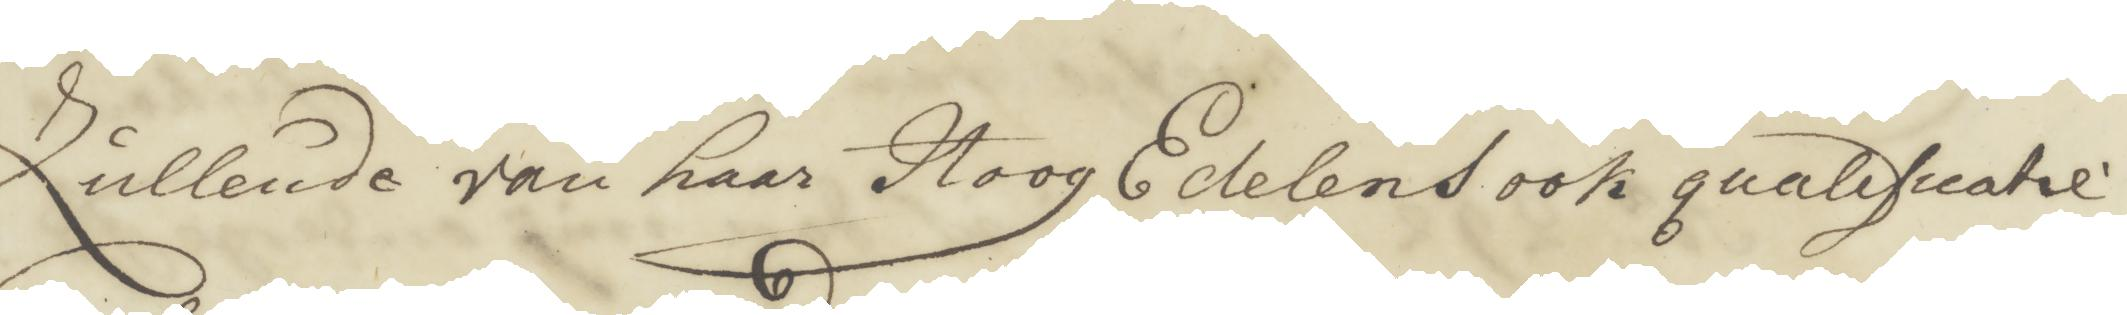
Zullende van haar Hoog Edelens ook qualificatie
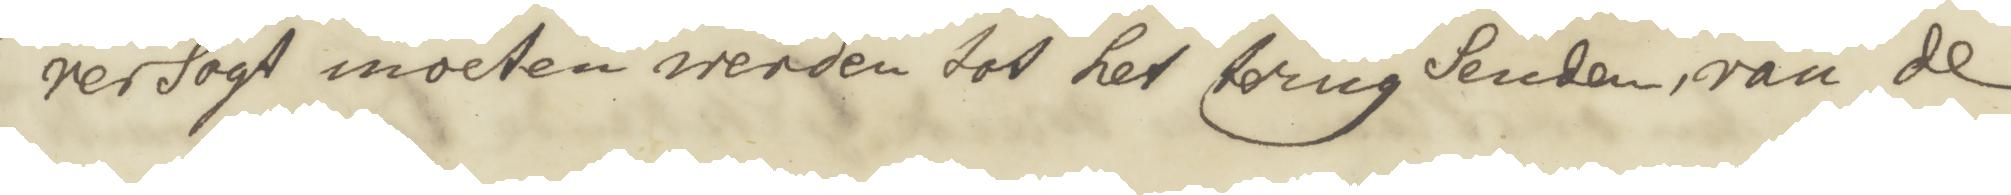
versogt moeten werden tot het terug senden, van de
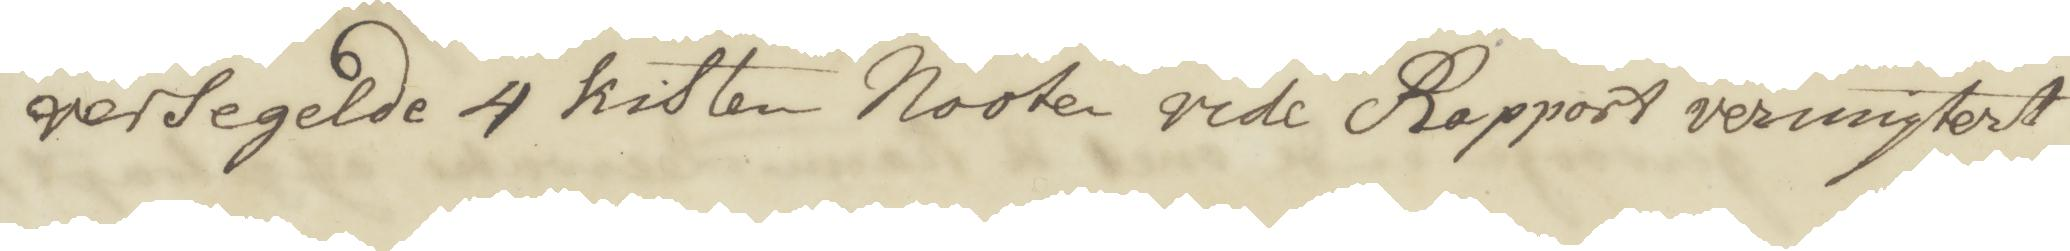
versegelde 4 kisten noote vide Rapport vermijtert
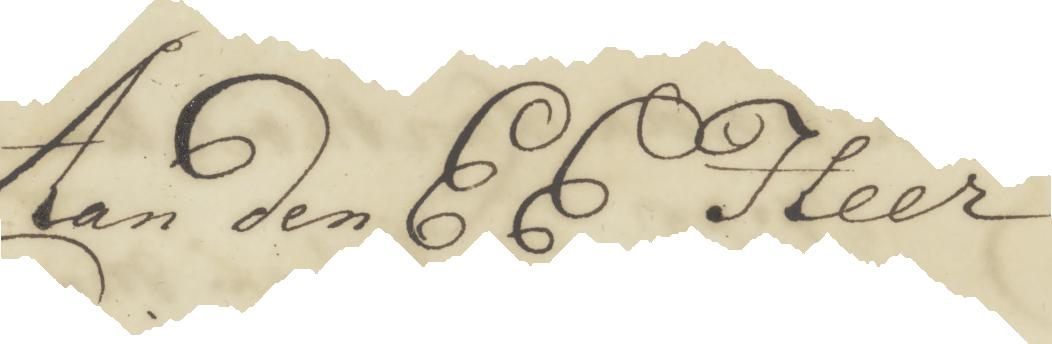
Aan den E E Heer
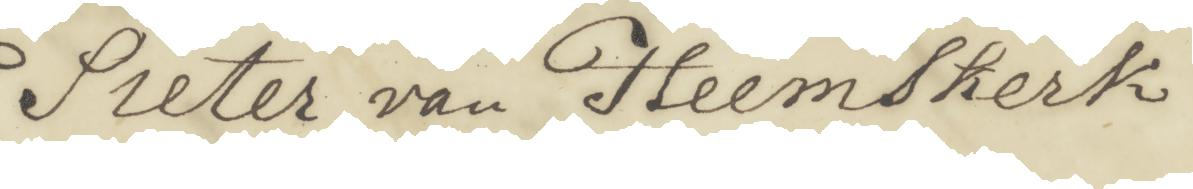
Pieter van Heemskerk
